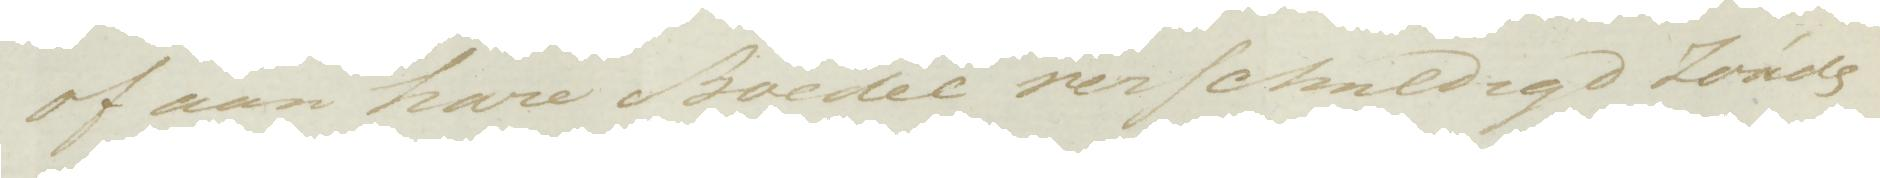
of aan hare Boedel verschuldigd zoude
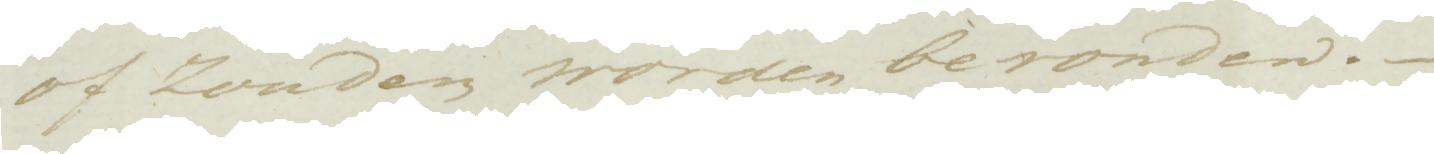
of zouden worden bevonden. –
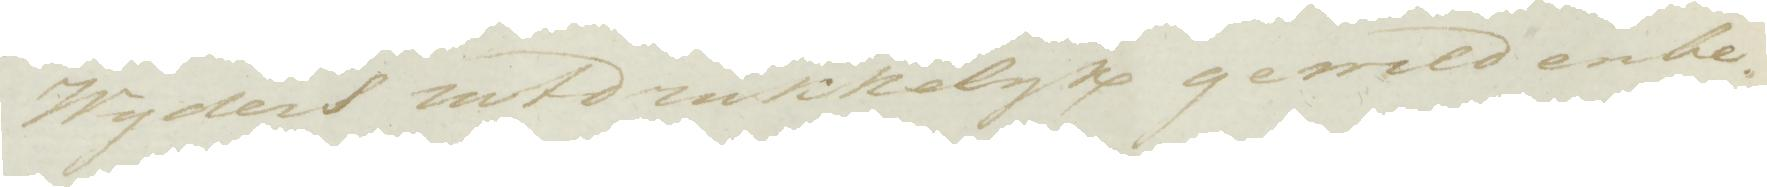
Wijders uitdrukkelyk gewild en be„
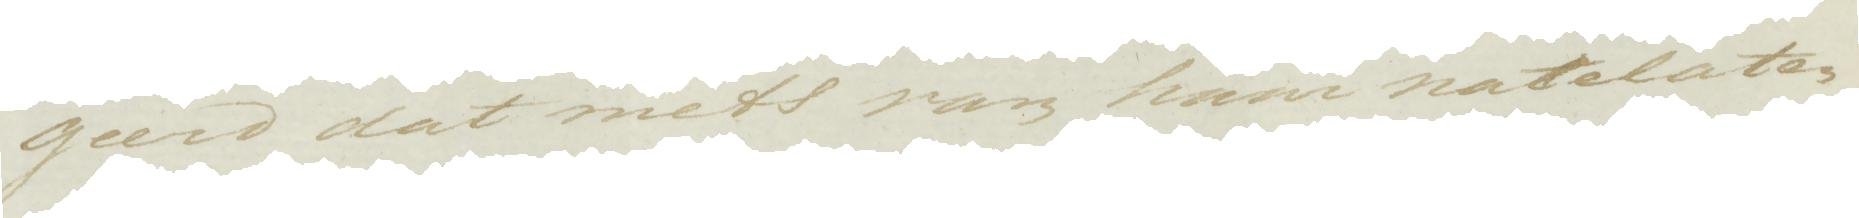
geerd dat niets van haar natelaten
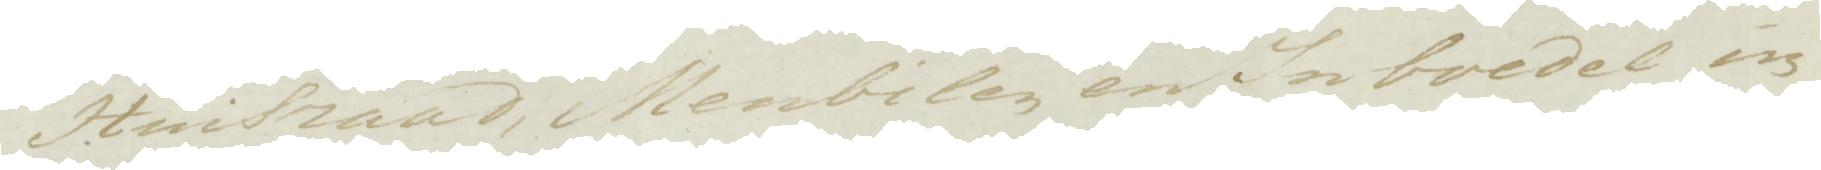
Huisraad, Meubilen en Inboedel in
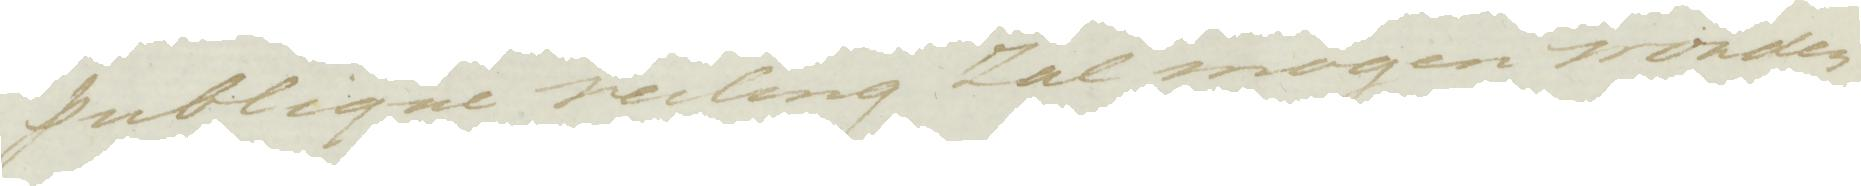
publique veiling zal mogen worden
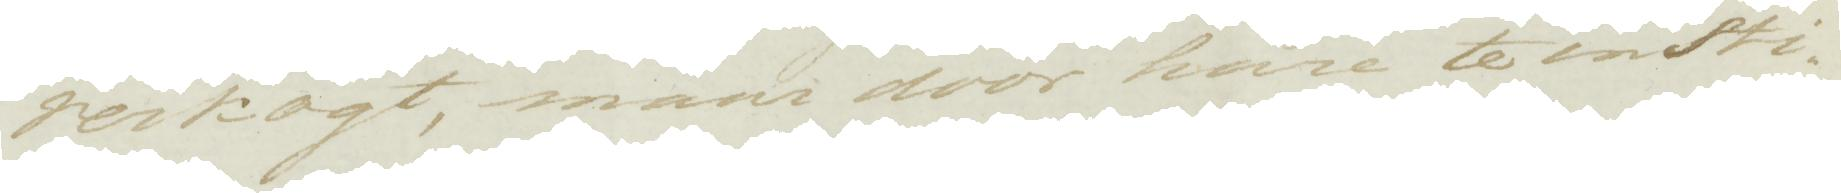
verkogt, maar door hare te insti„
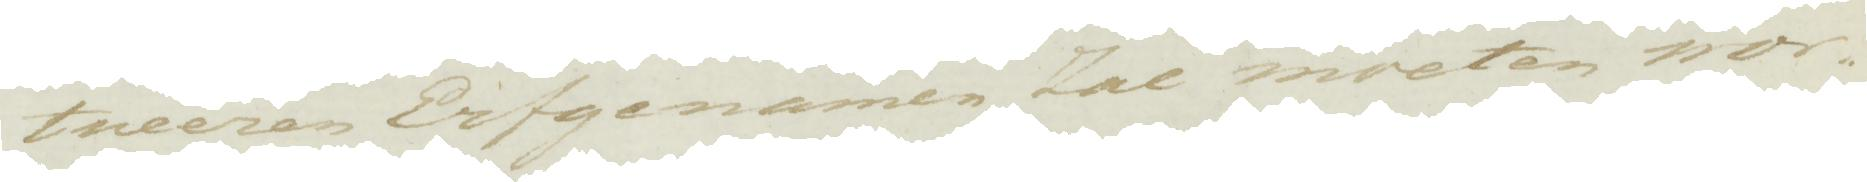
tueeren Erfgenamen zal moeten wor„
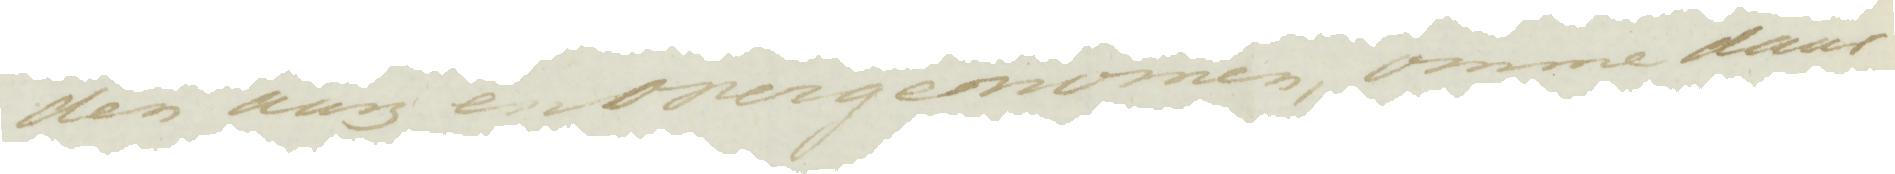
den aan en overgenomen, omme daar
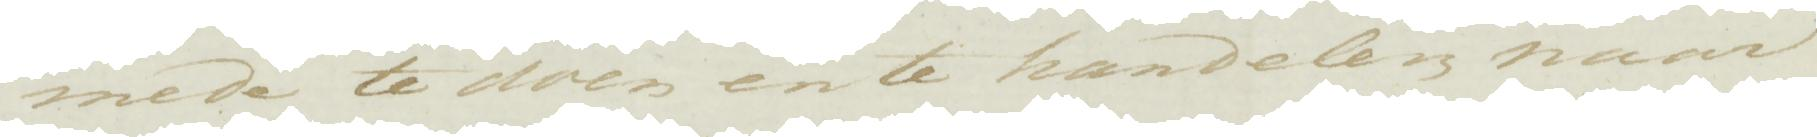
mede te doen en te handelen naar
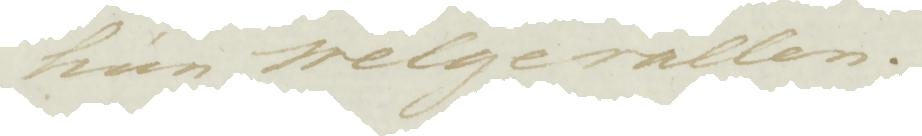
hun welgevallen.
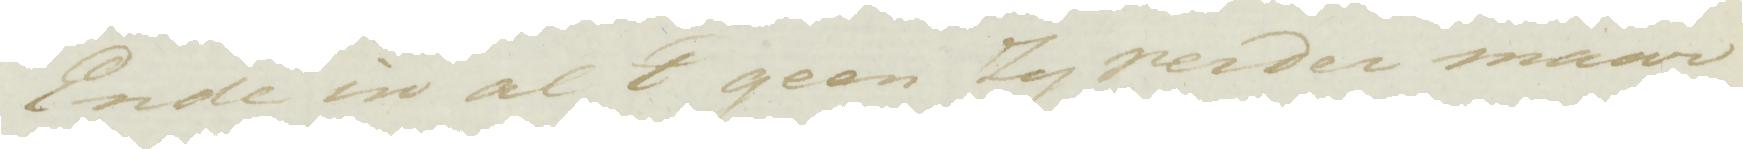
Ende in al ’t geen zy verder maar
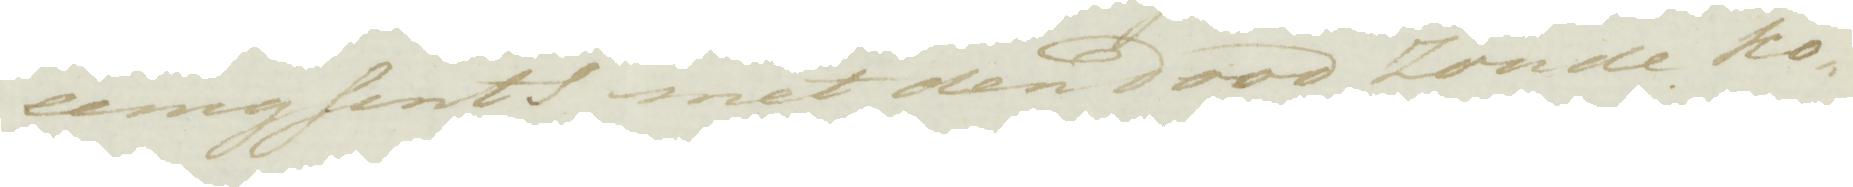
eenigsints met den dood zoude ko„
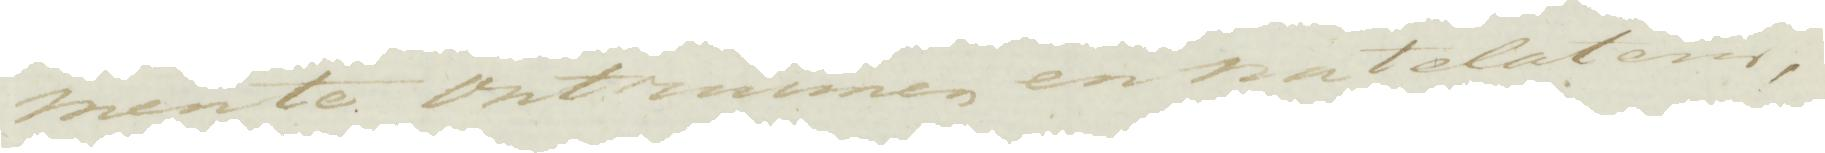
men te ontruimen en natelaten,
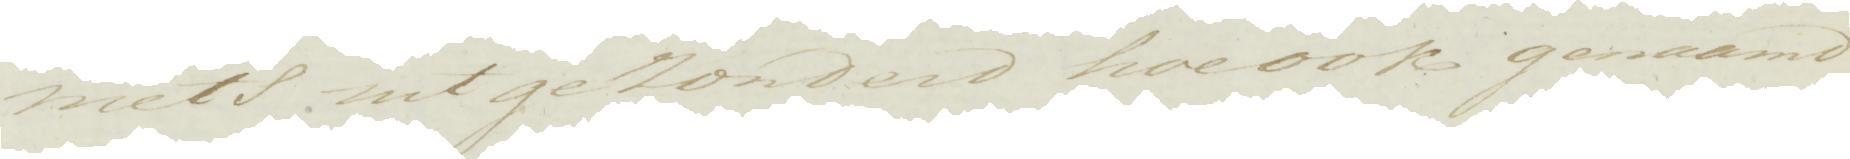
niets uitgezonderd hoe ook genaamd,
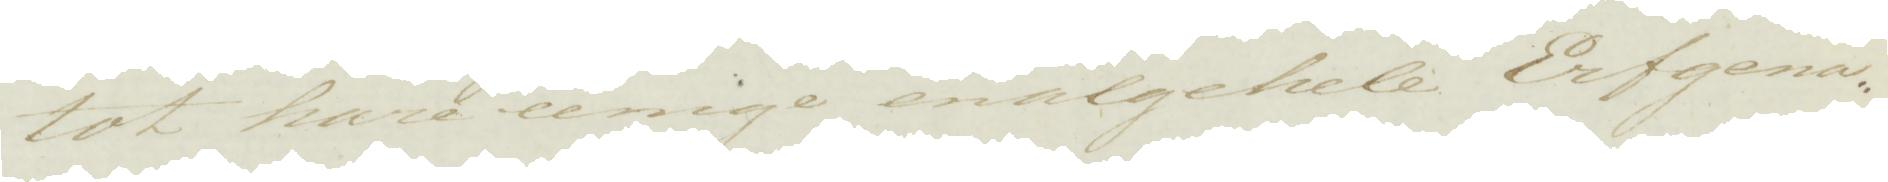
tot hare eenige en algehele Erfgena„
